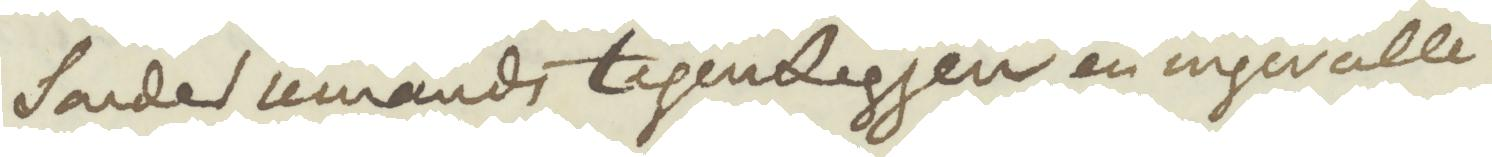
Sonder iemands tegenzeggen en ingevalle
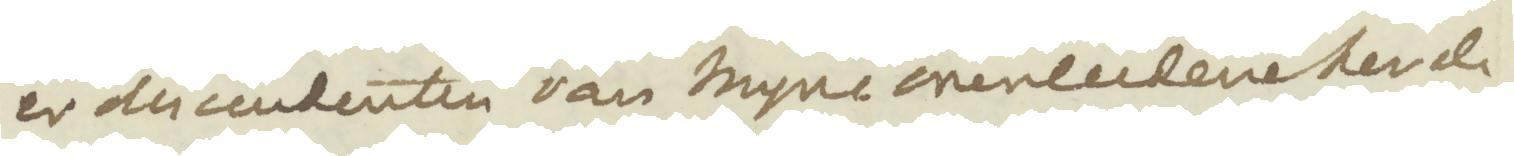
er descendenten van Myne overleedene kinde
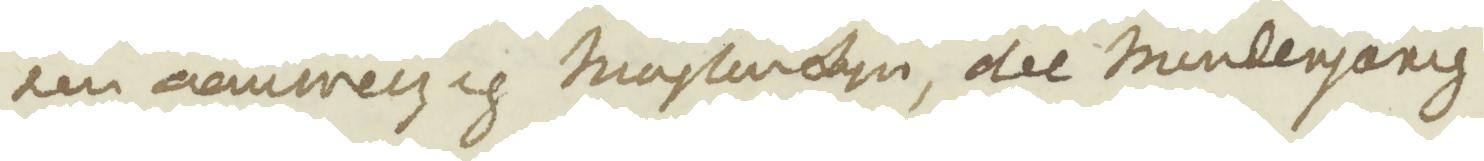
ren aanwezig mogten zyn, die Minderjarig
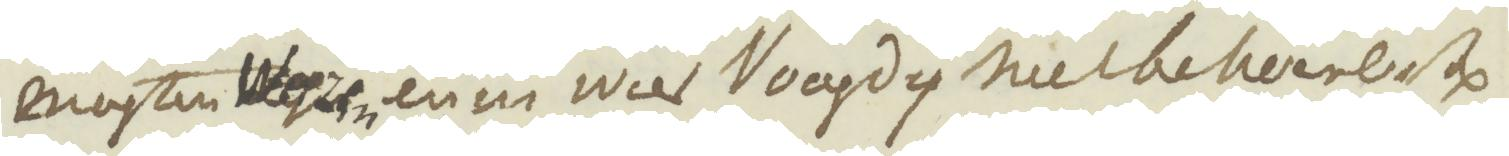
mogten weezen en in wier Voogdy niet behoorlyk
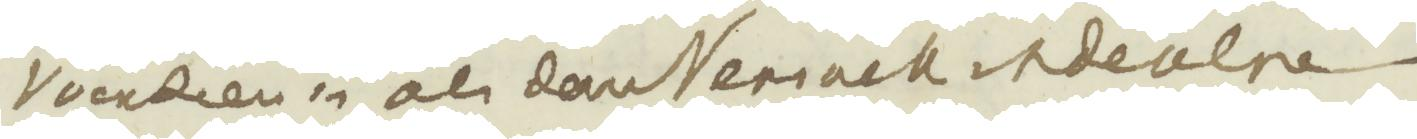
Voorzien is als dan Verzoek ik deselve
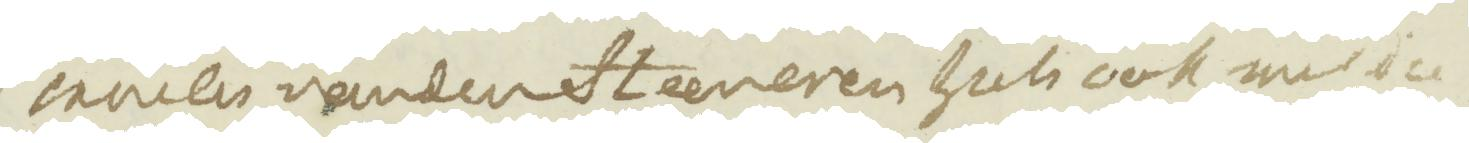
Cornelis van den Steenoven zich ook met de
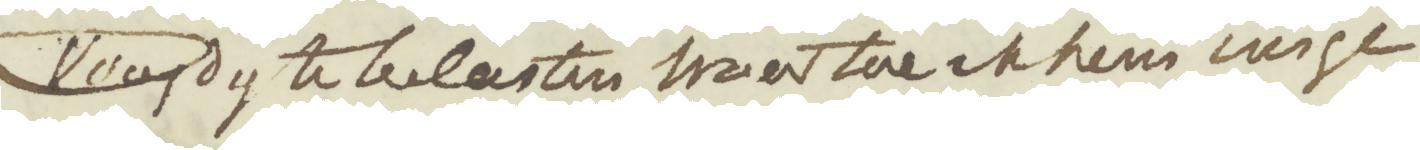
Voogdy te belasten waertoe ik hem insge
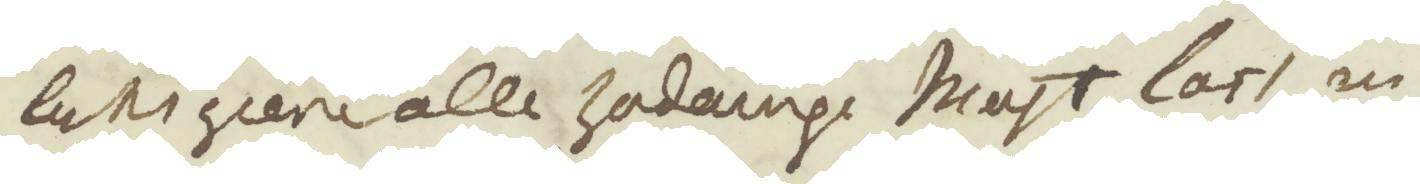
lyks geeve alle zodanige Magt last en
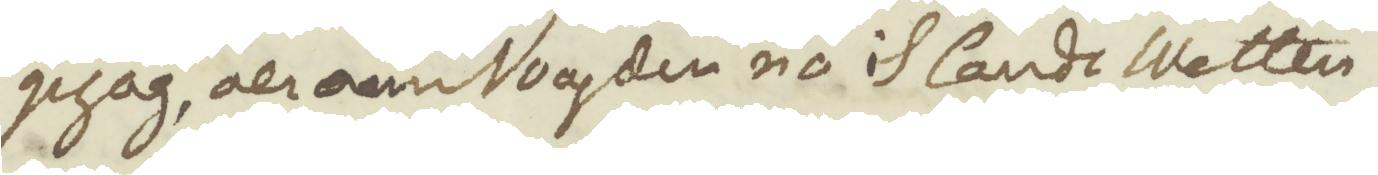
gezag, als aan Voogden na 'S Lands Wetten
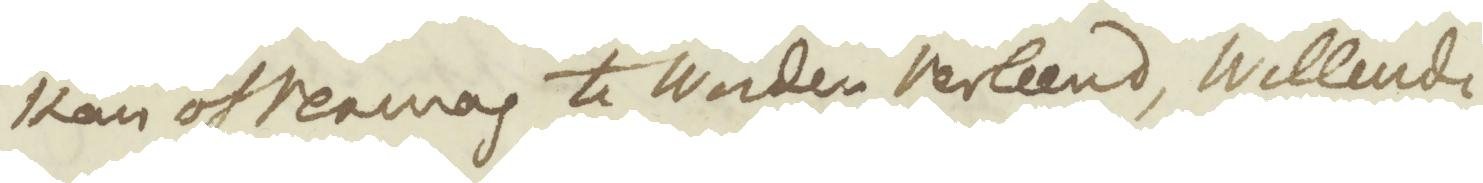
kan of vermag te werden verleend, willende
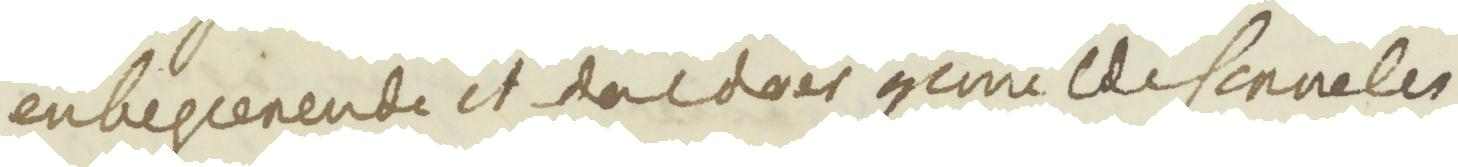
en begeerende ik dat door gemelde Cornelis
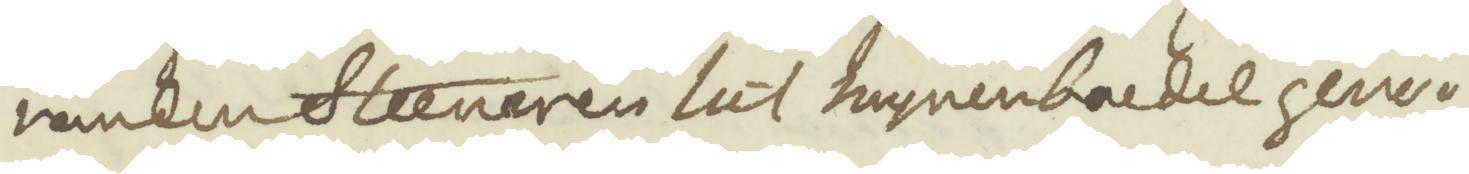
van den Steenoven uit mynen boedel genoo
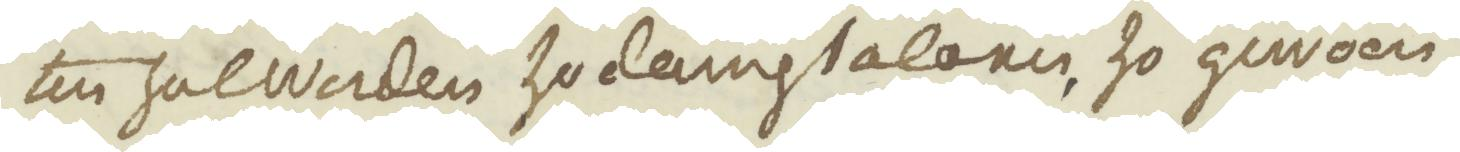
ten sal werden zodanig salaris, zo gewoon
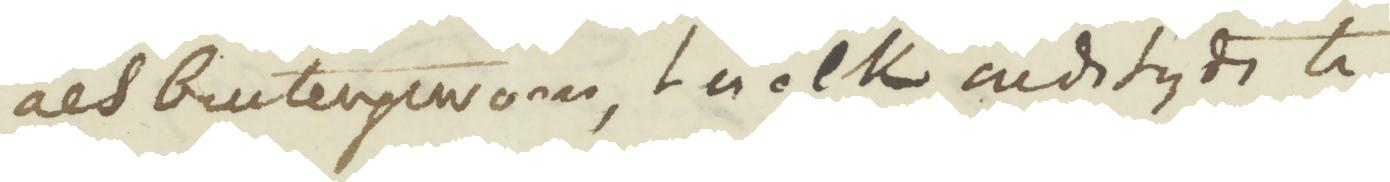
als buitengewoon, t welk oudtyds te
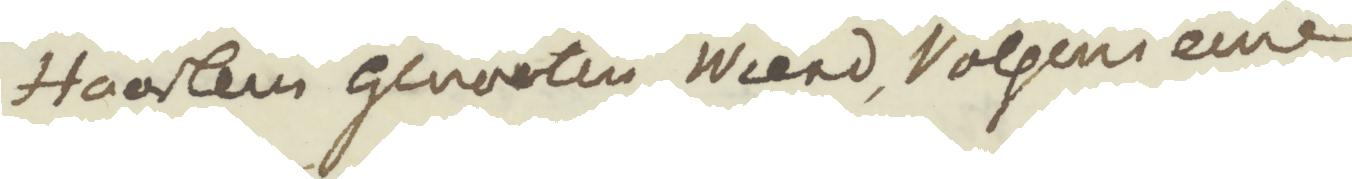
Haarlem genooten wierd, volgens eene
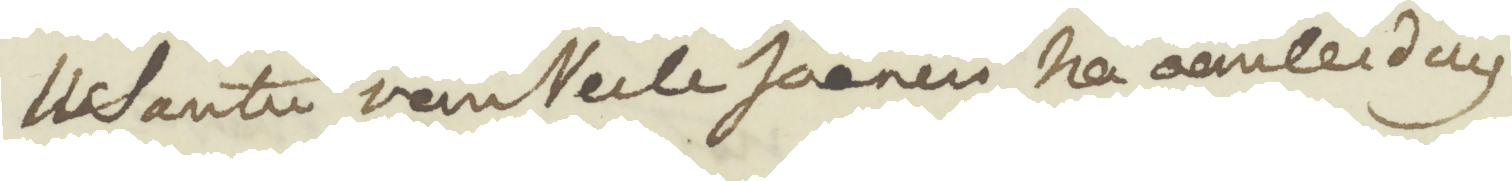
Usantie van Veele Jaaren na aanleiding
